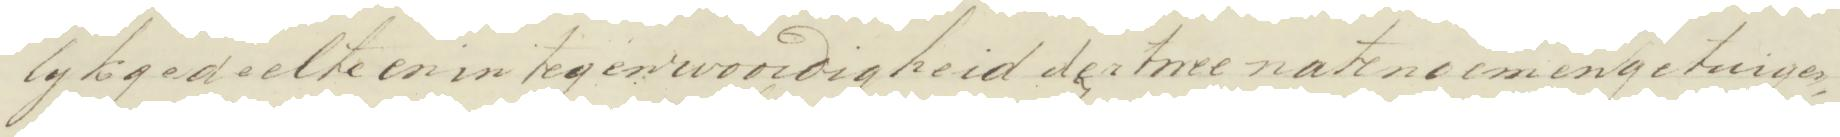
lyk gedeelte en in tegenwoordigheid der twee na te noemen getuigen,
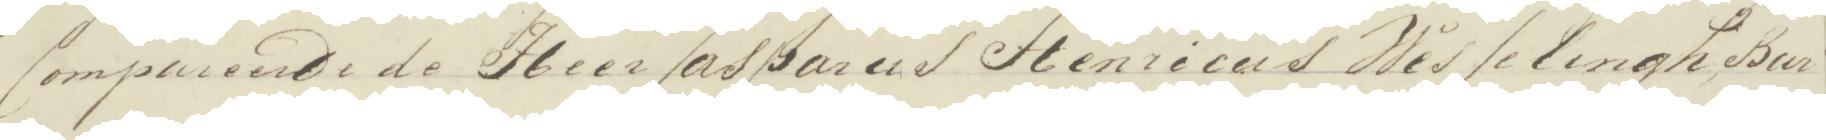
Compareerde de Heer Casparus Henricus Wesselingh Bur
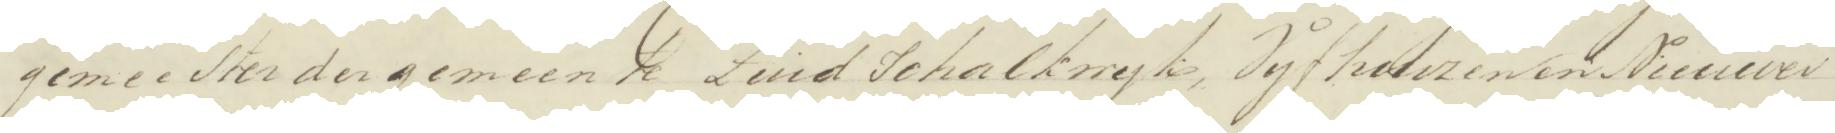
gemeester der gemeente Zuid schalkwyk, Vyfhuizen en Nieuwer
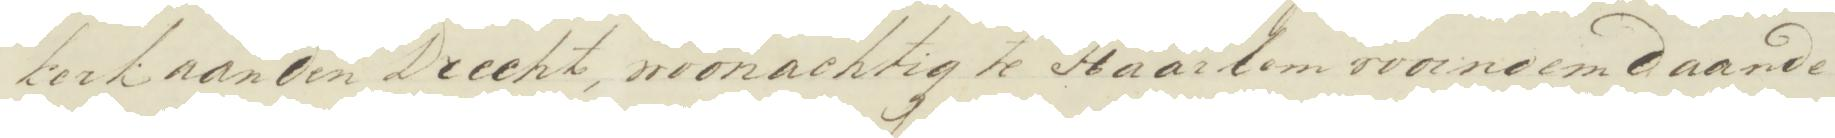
kerk aan den Drecht, woonachtig te Haarlem voornoemd aan de
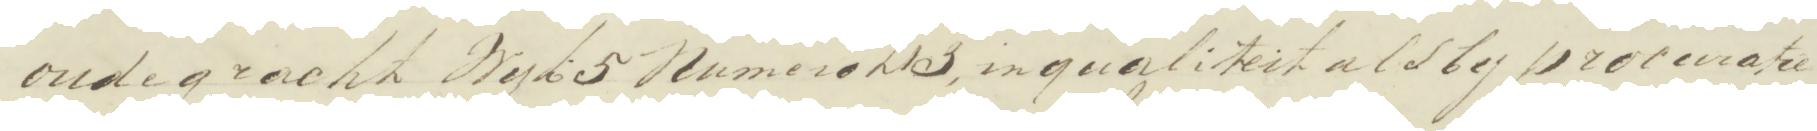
oude gracht Wyk 5 Numero 213, in qualiteit als by procuratie
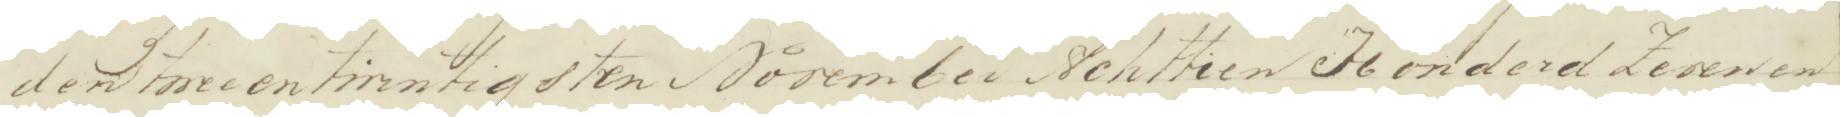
den twee en twintigsten November Achttien Honderd Zeven en
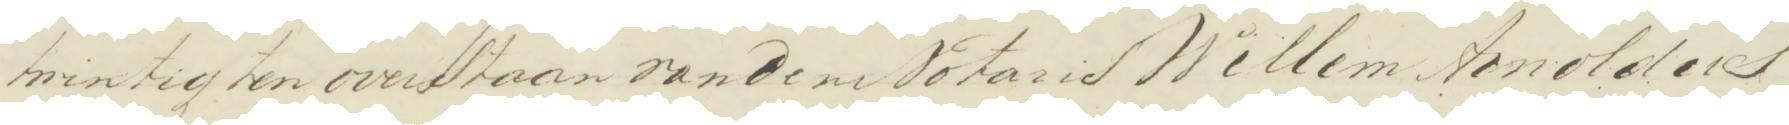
twintig ten overstaan van den Notaris Willem Arnoldus
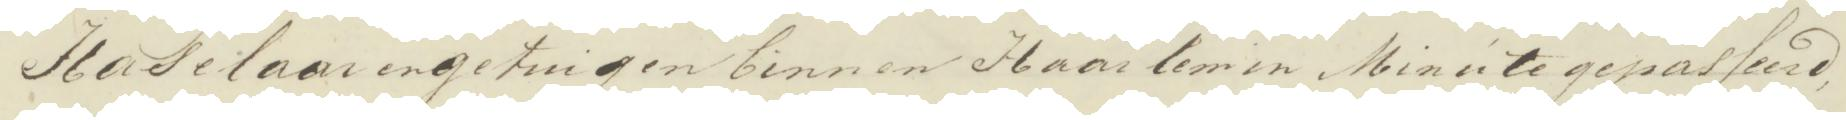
Haselaar en getuigen binnen Haarlem in Minute gepasseerd,
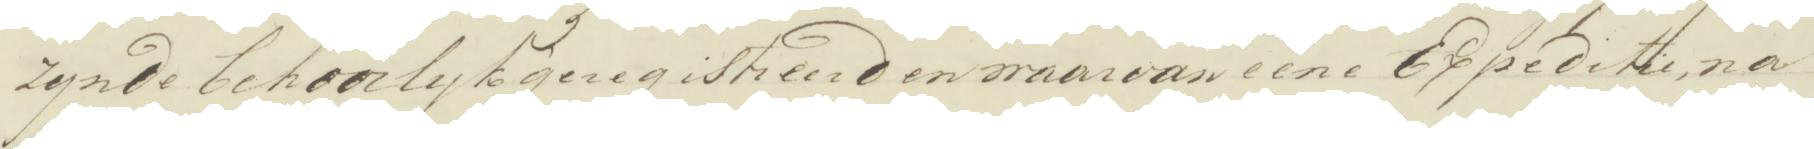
zynde behoorlyk geregistreerd en waarvan eene Expeditie, na
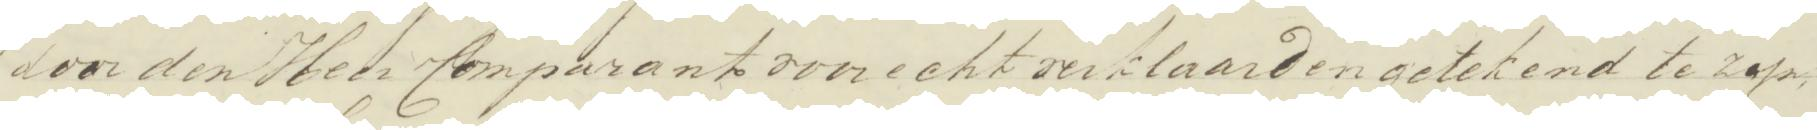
door den Heer Comparant voor echt verklaard en getekend te zyn,
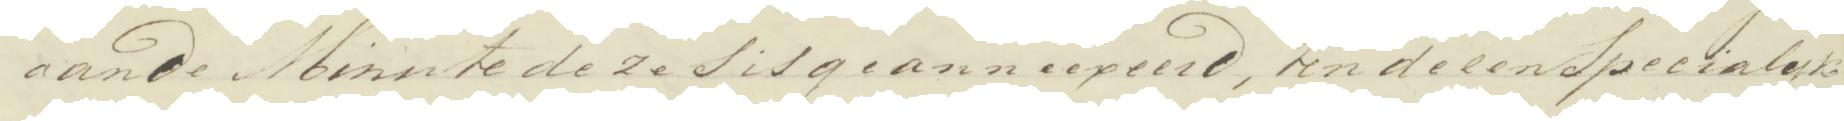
aan de Minute deze is geanneexeerd, ten delen specialyk
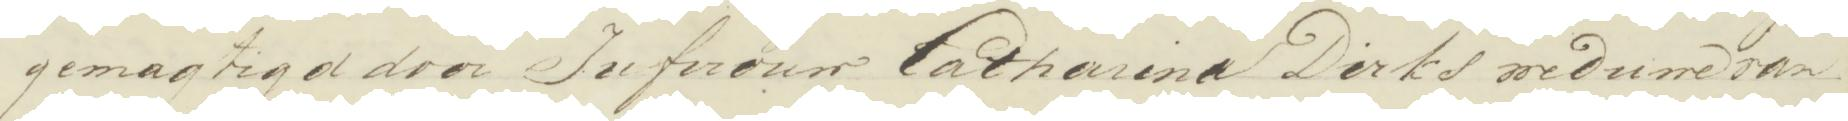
gemagtigd door Iufvrouw Catharina Dirks weduwe van
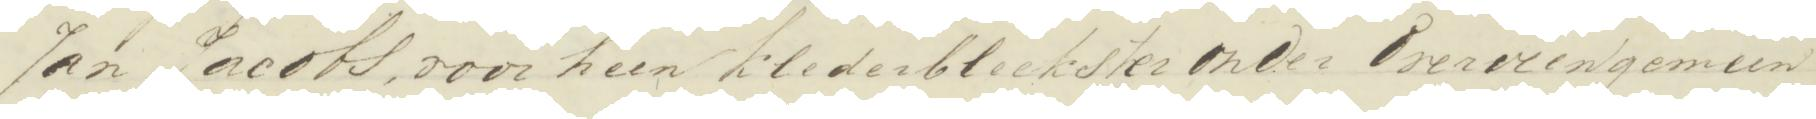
Jan Jacobs, voor heen klederbleekster onder Overveen gemeen
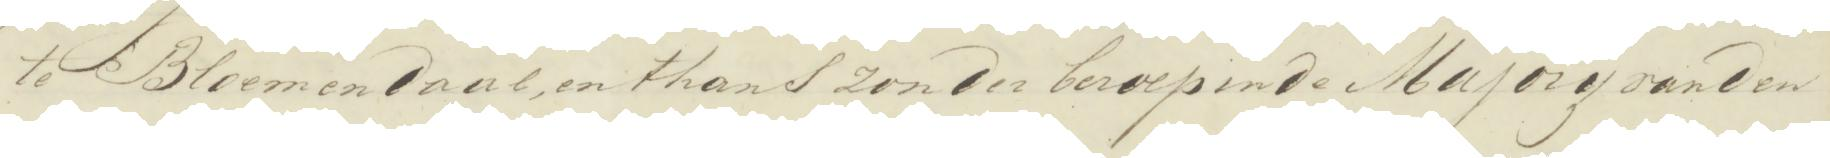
te Bloemen daal, en thans zonder beroep in de Majory van den
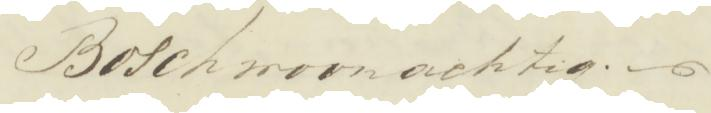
Bosch woonachtig.-
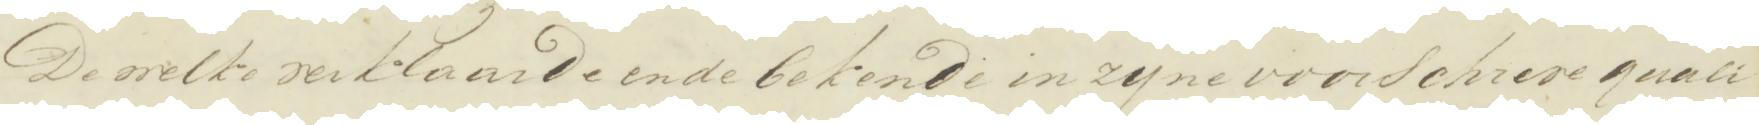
De welke verklaarde en de bekende in zyne voorschreve quali
